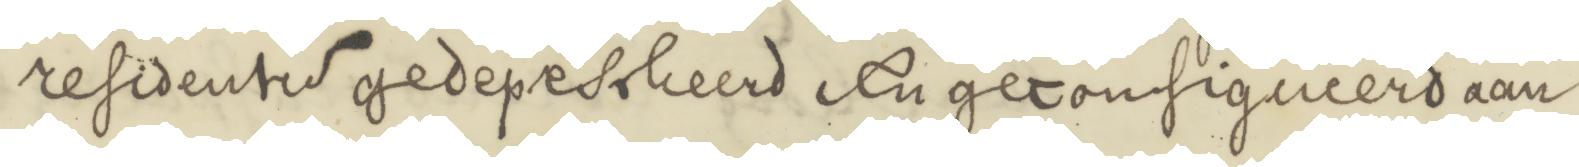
residentis gedepescheerd en geconsigneerd aan
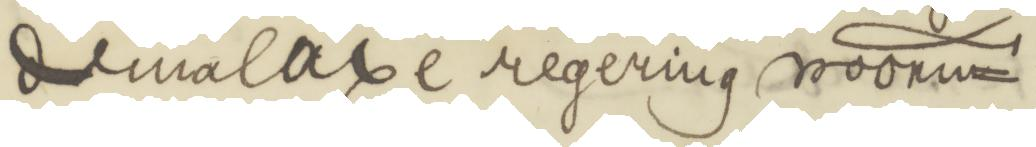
de malaxe regering voorm=t
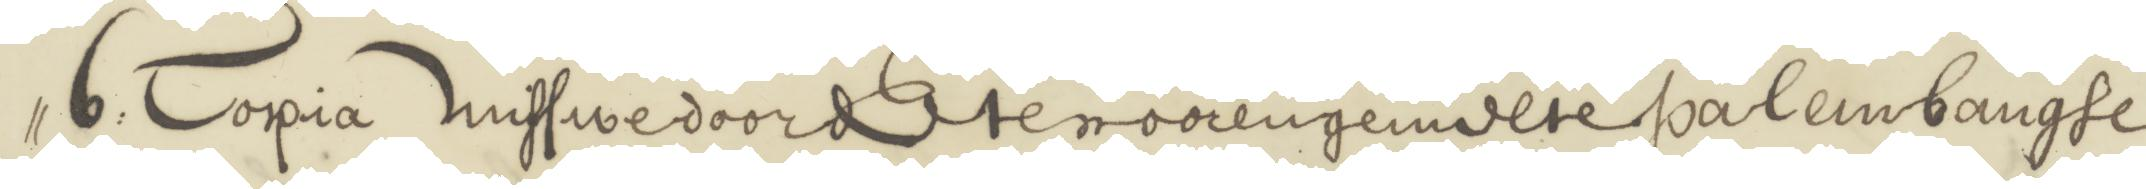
„6: Copia missive door de te voorengemelte palembangse
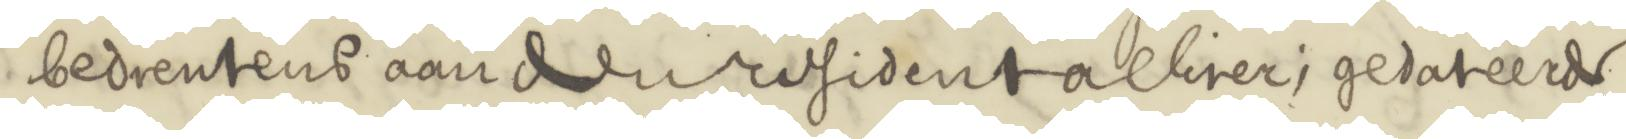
bedientens aan den resident alhier; gedateerde
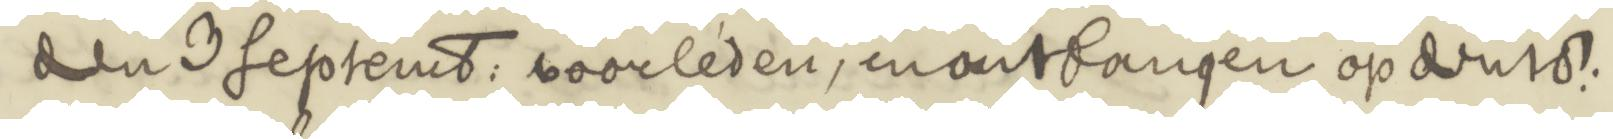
den 3 septemb: voorleden, en ontfangen op den 18:
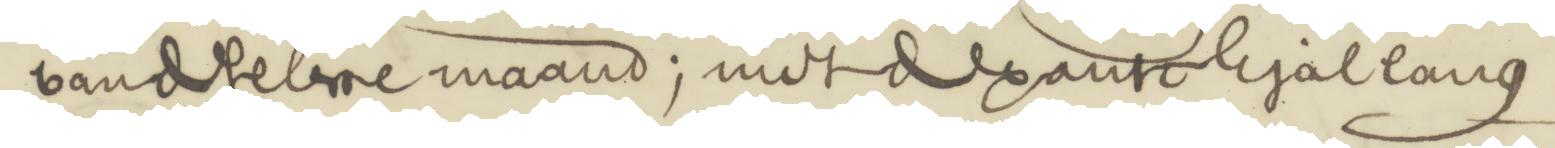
van deselve maand; met depantchjallang
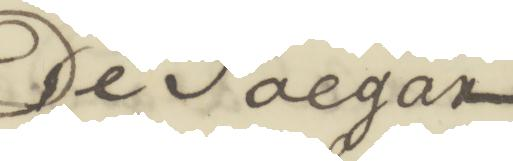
de Poegar
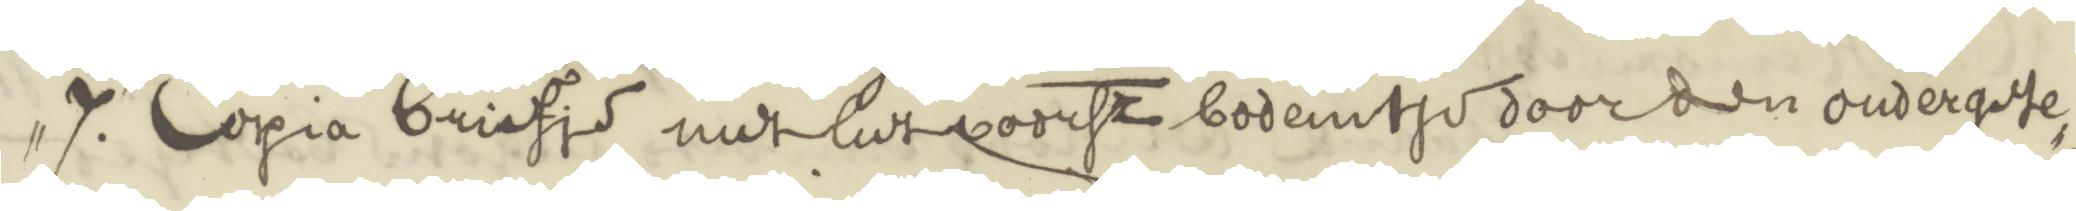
„7. Copia briefje met het voorsz bodemtje door den ondergete„
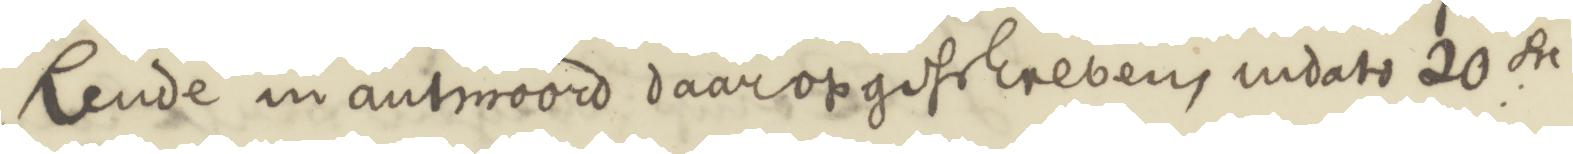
kende in antwoord daarop geschreven, indato 20 :en
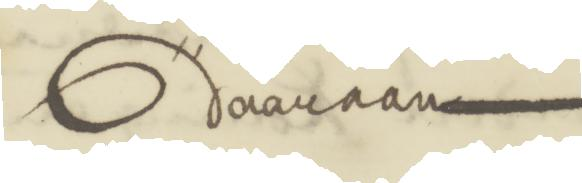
daaraan.
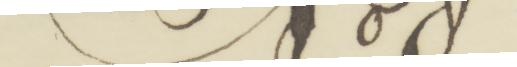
No 8.
